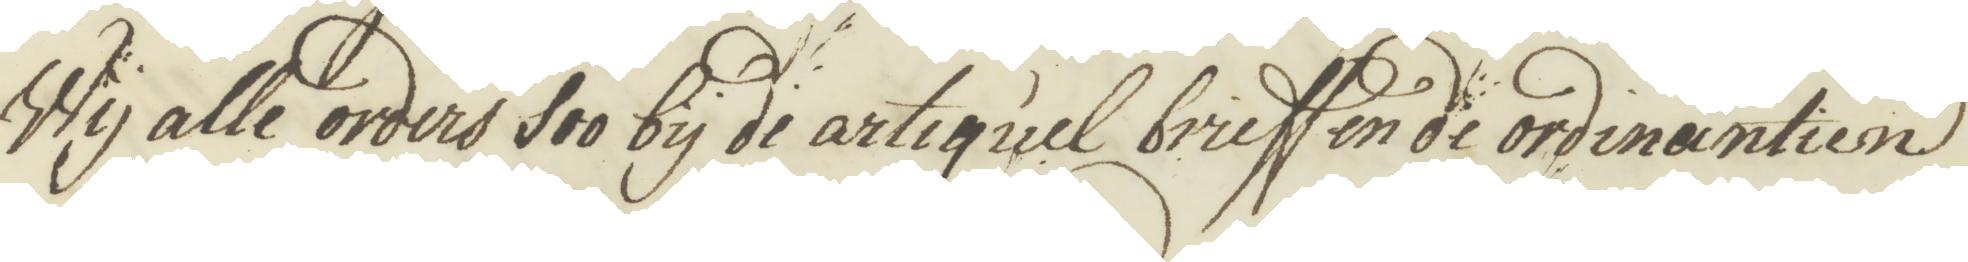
wij alle orders soo bij de artiquel brieff en de ordinantien
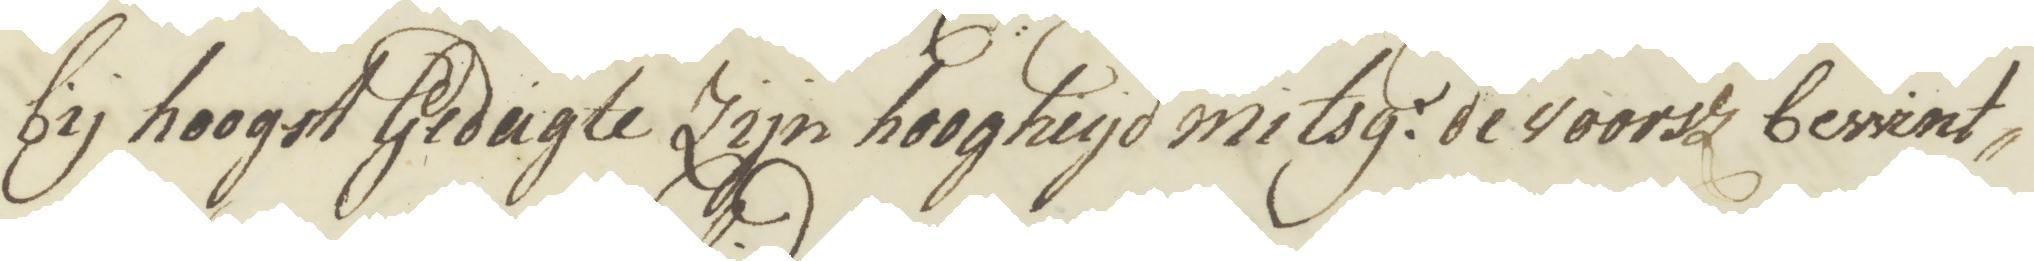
bij hoogst Gedagte zijn hoogheijd mitsg: de voorsz bewint„
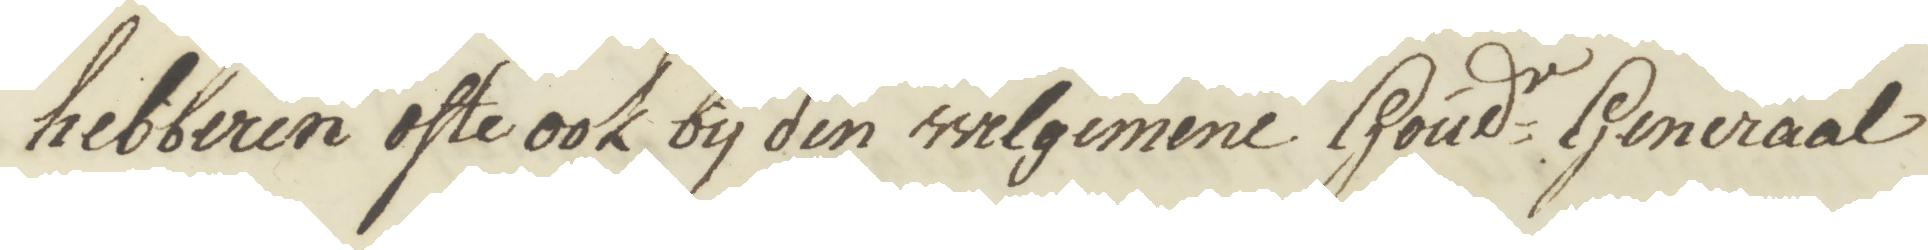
hebberen ofte ook bij den welgemene Gouv=r Generaal
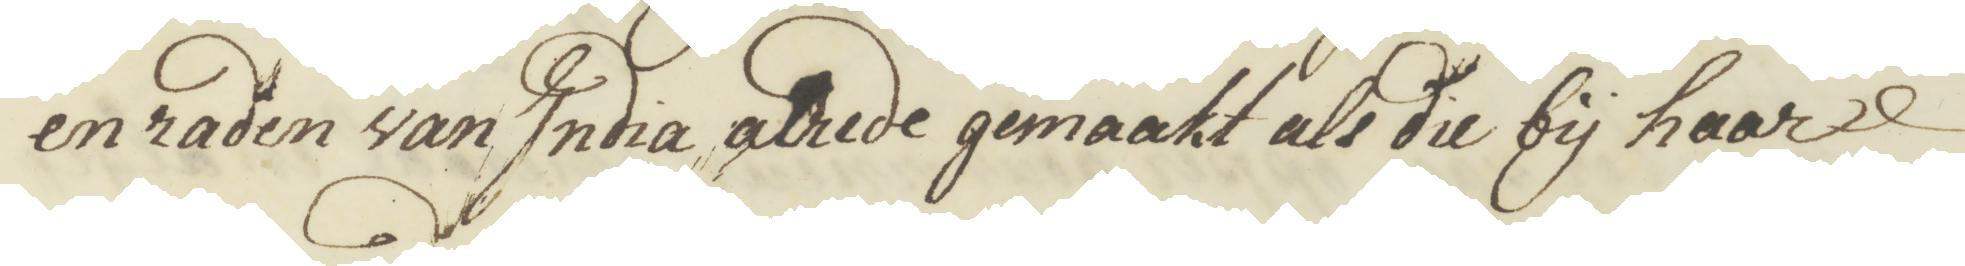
en raden van Jndia alrede gemaakt als die bij haar
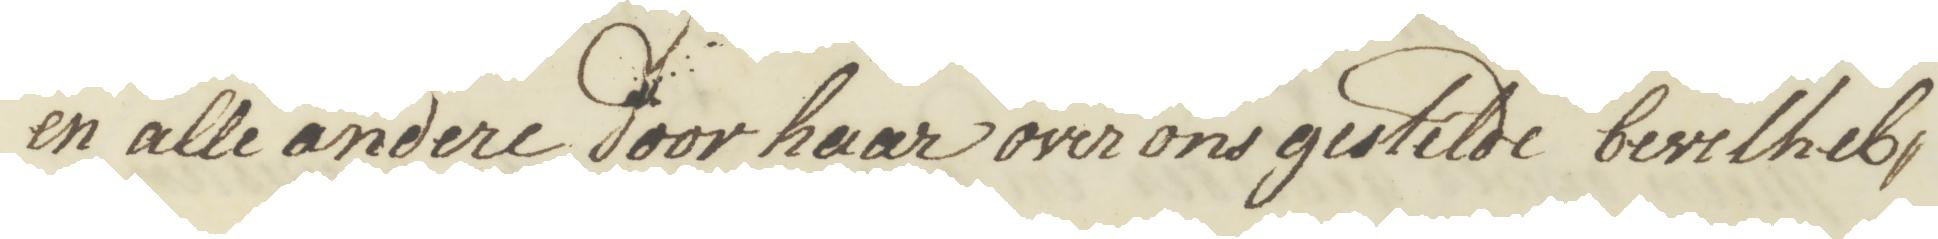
en alle andere door haar over ons gestelde bevelheb„
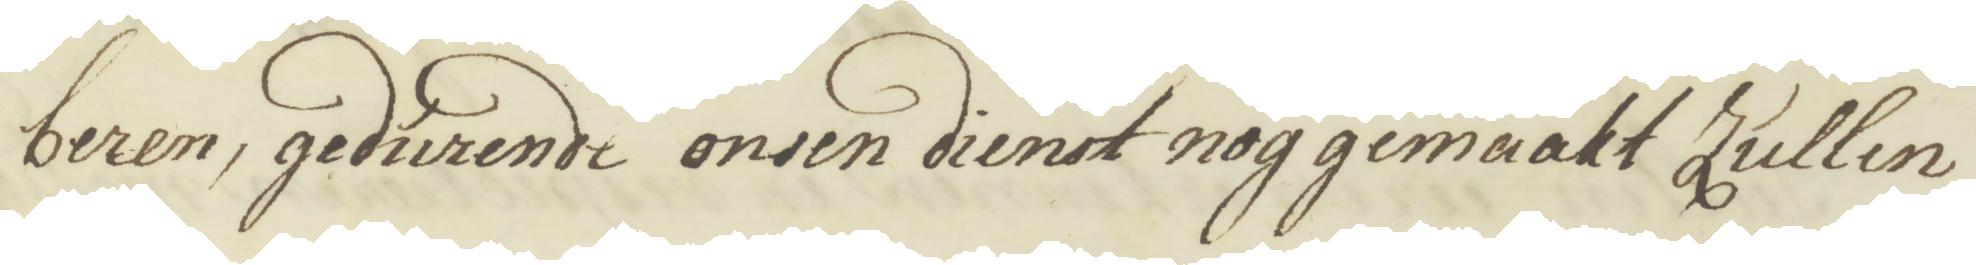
beren, gedurende onsen dienst nog gemaakt zullen
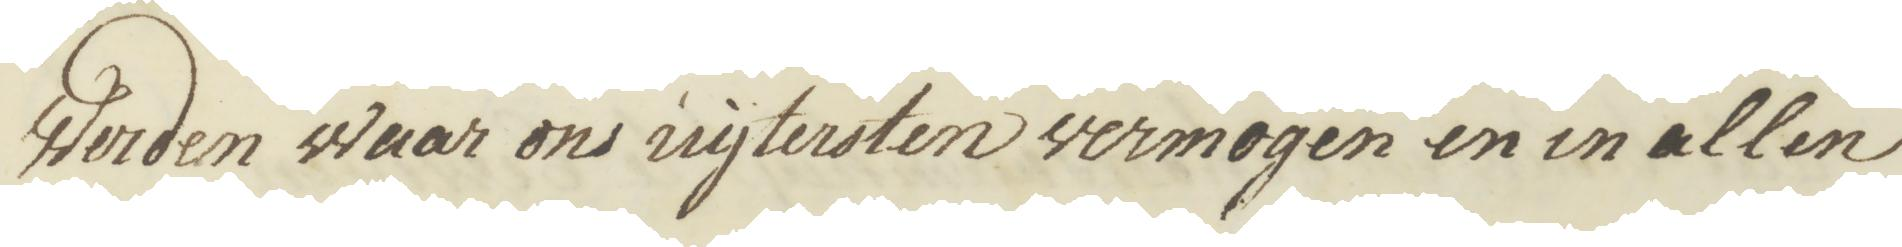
werden waar ons uijtersten vermogen en in allen
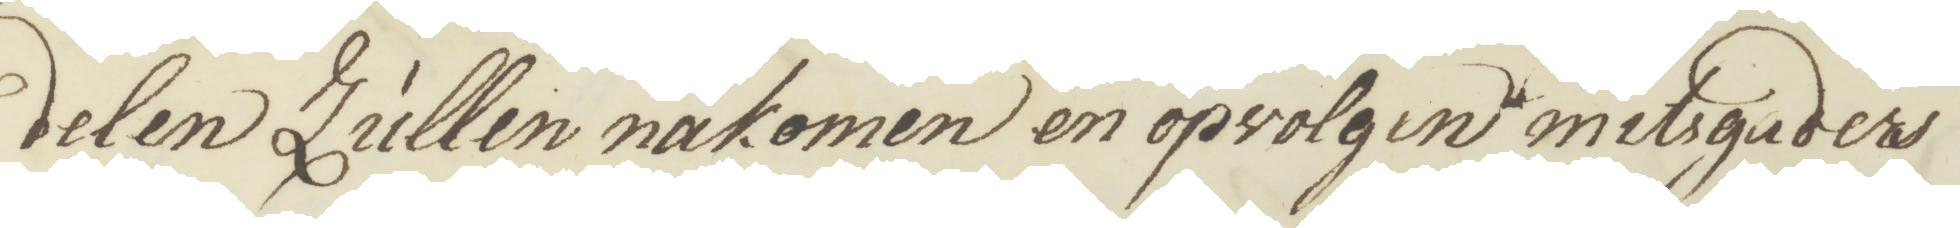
delen zullen nakomen en opvolgen mitsgaders
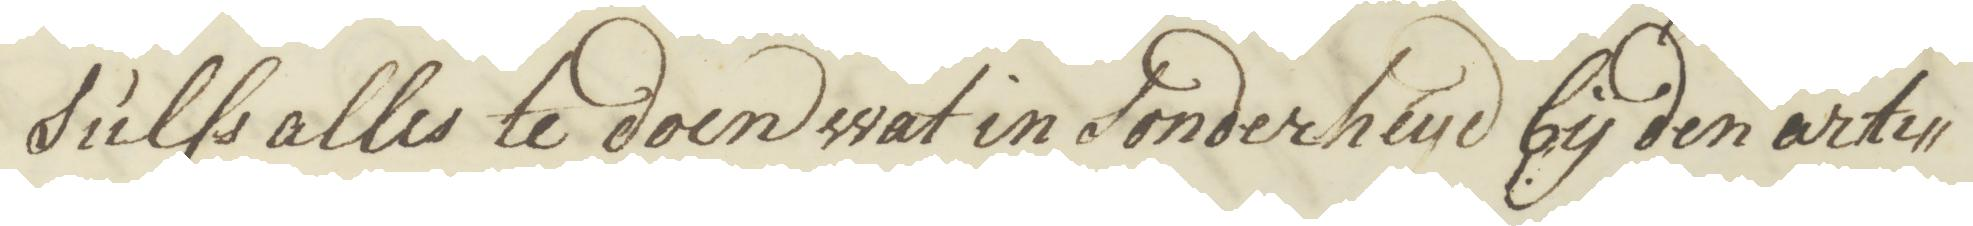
sulcs alles te doen wat in sonderheijd bij den arti„
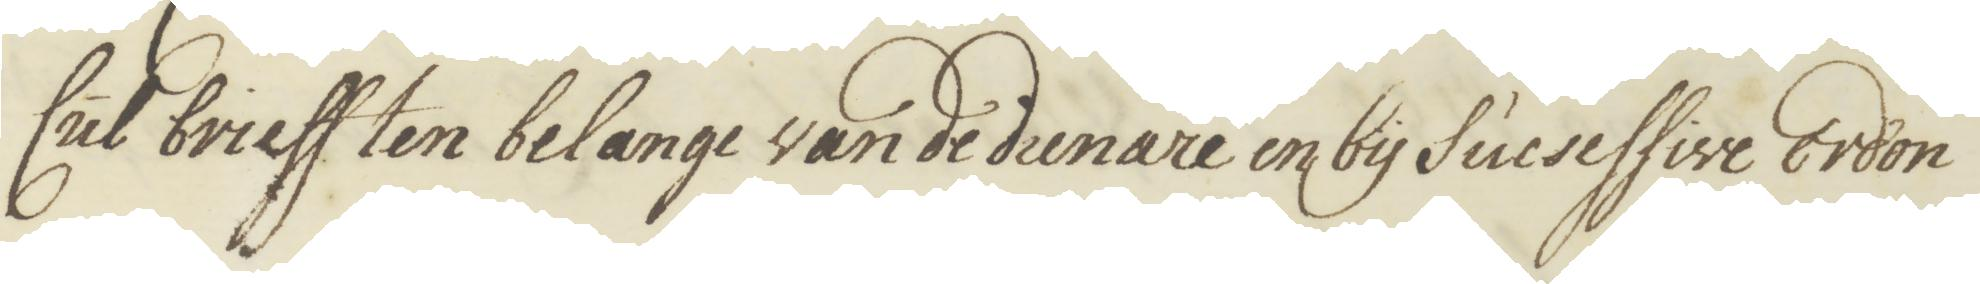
cul brieff ten belange van de dienare en bij sucsessive ordon
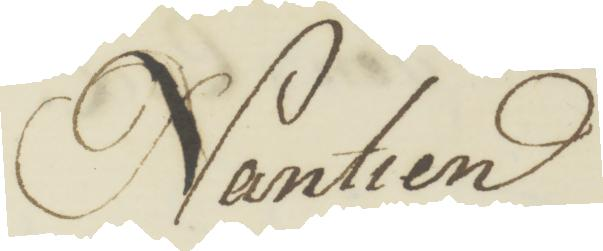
Nantien
